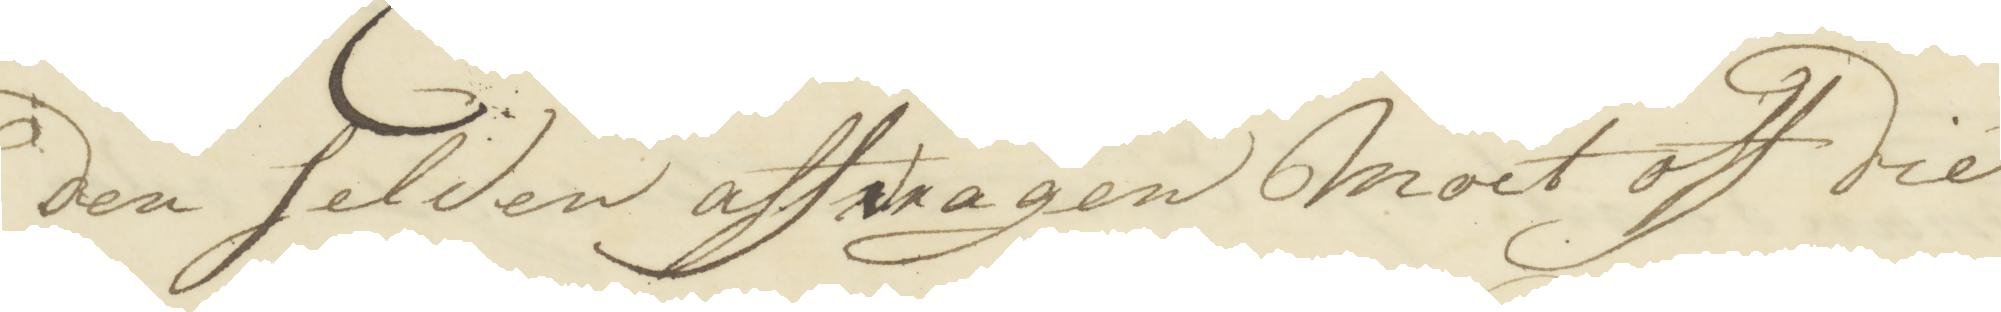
den selven affdragen moet off die
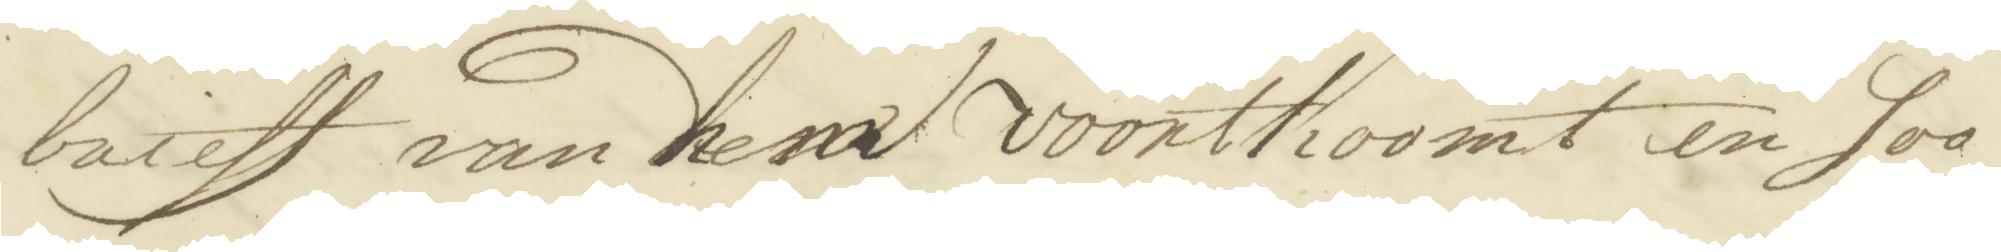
brieff van hem voortkoomt en soo
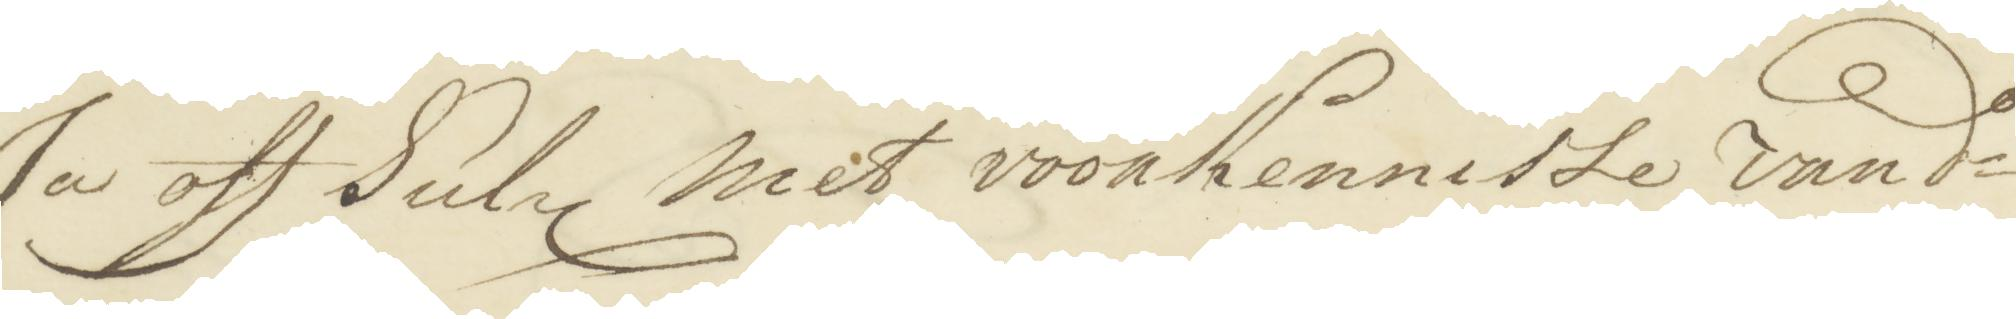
Ja off sulx met voorkennisse van d=o
